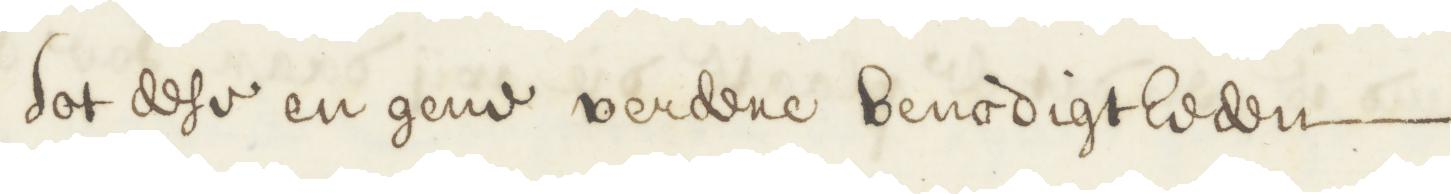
tot dese en gene verdere benodigtheden
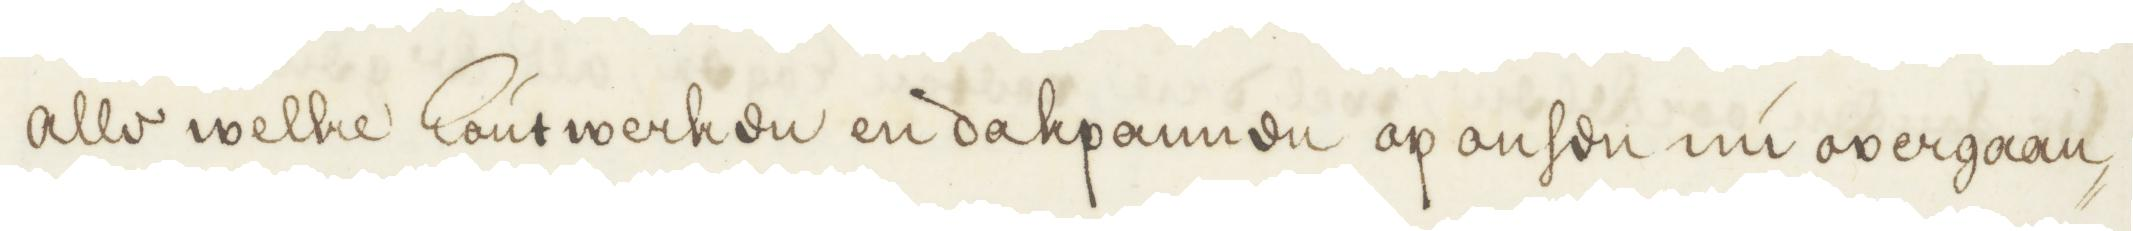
alle welke houtwerken en dakpannen op onsen nu overgaan„
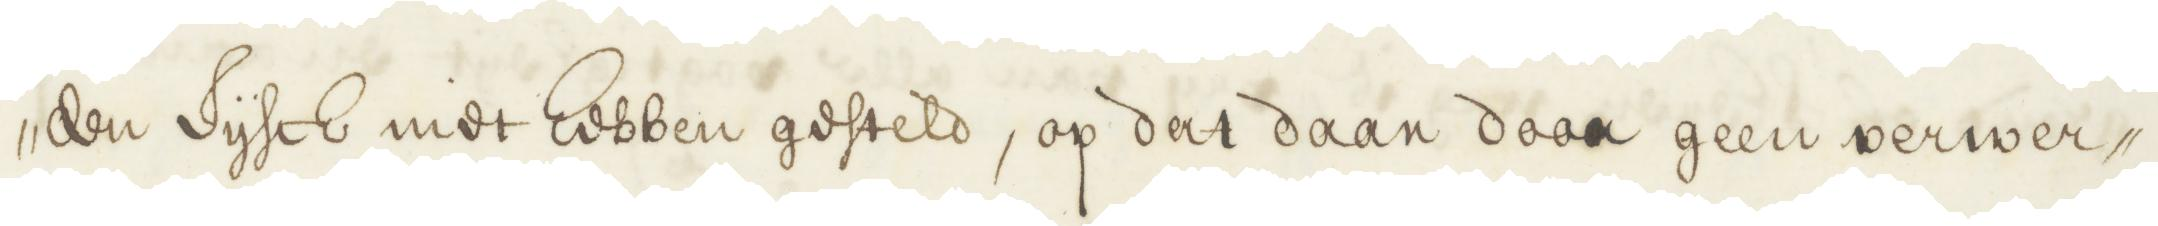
„den Eijsch niet hebben gesteld, op dat daar door geen verwer„
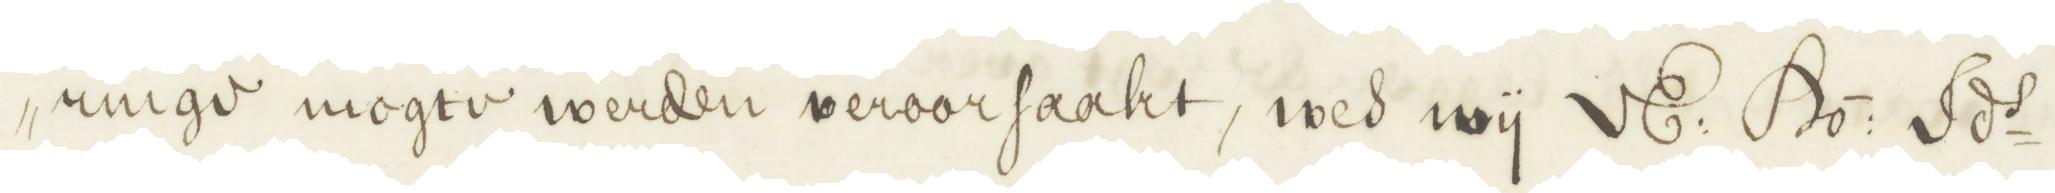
„ringe mogte werden veroorsaakt, wes wij vE: Ho: Ed=s
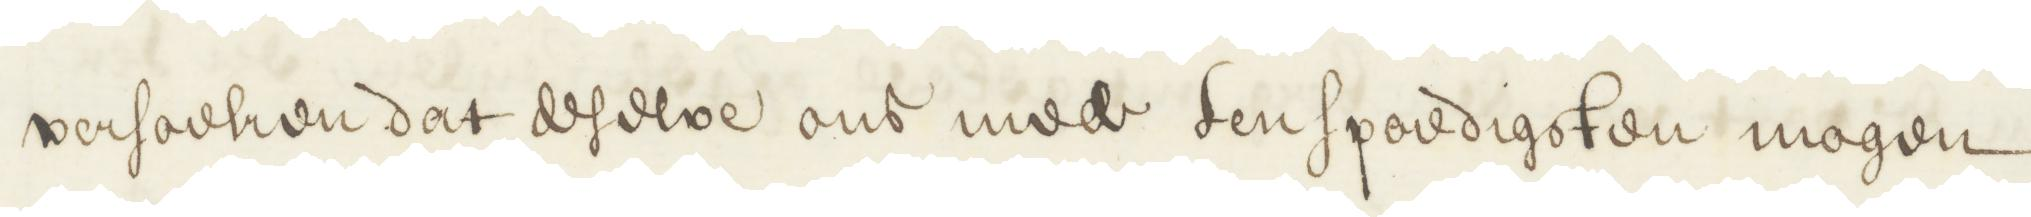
versoeken dat deselve ons mede ten spoedigsten mogen
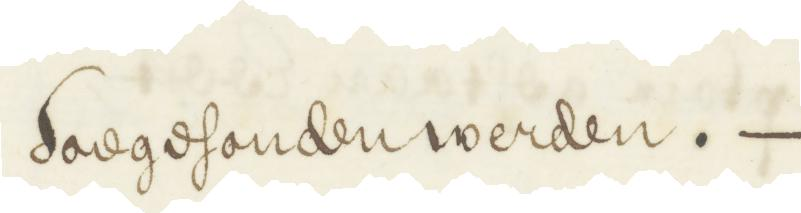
toegesonden werden.—
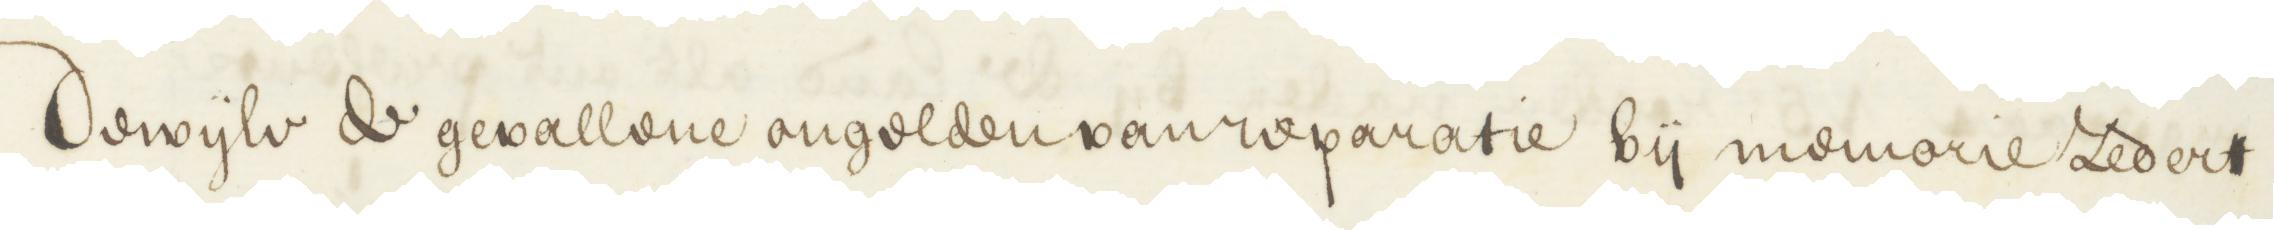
dewijle de gevallene ongelden van reparatie bij memorie zedert
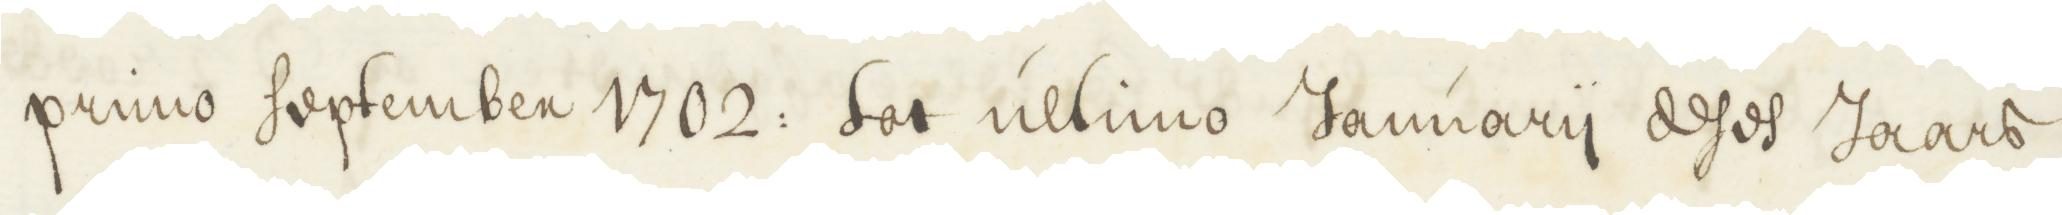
prino september 1702: tot ultimo Januarij deses Jaars
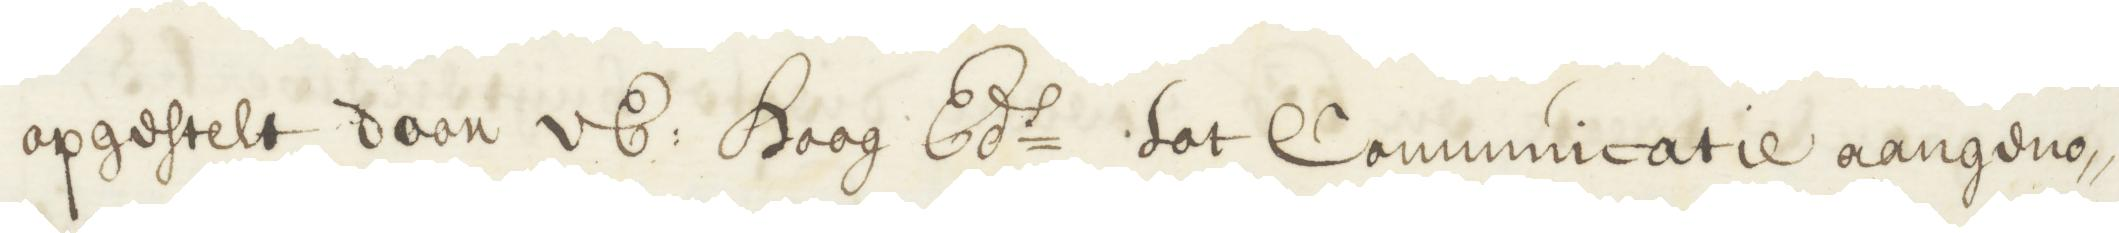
opgestelt door vE: Hoog Ed=s tot Commuicatie aangeno„
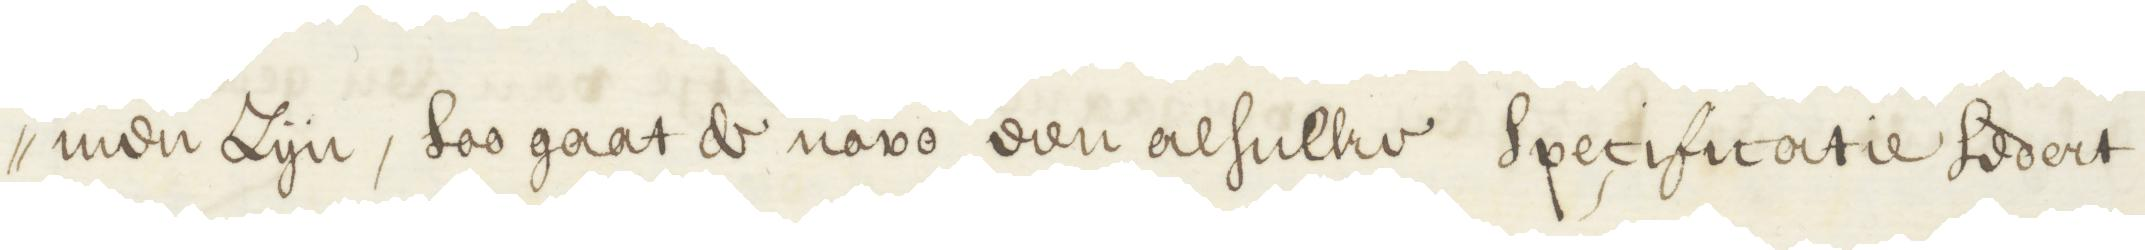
„men zijn, soo gaat de novo een alsulke specificatie sedert
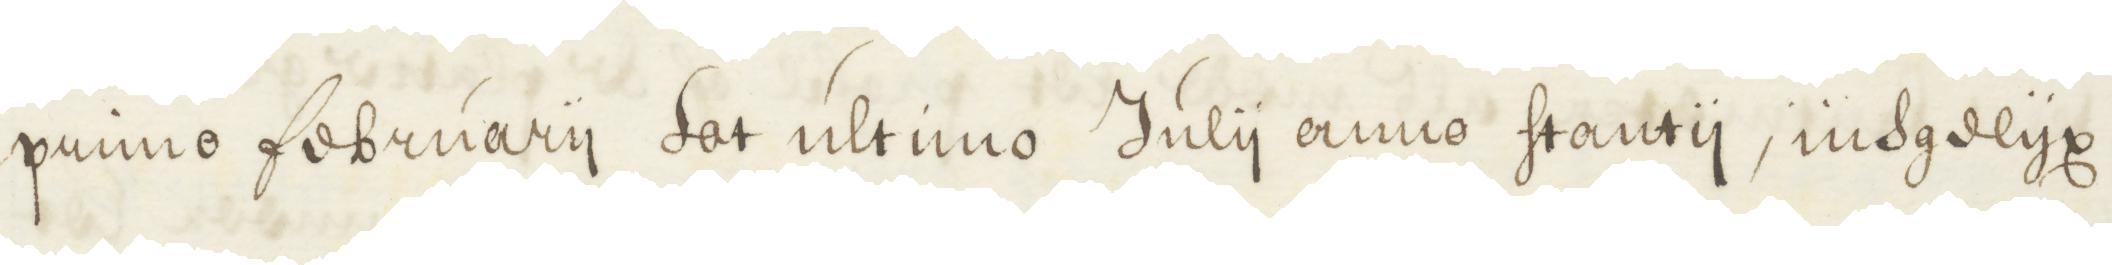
primo februarij tot ultimo Julij anno stantij, insgelijx
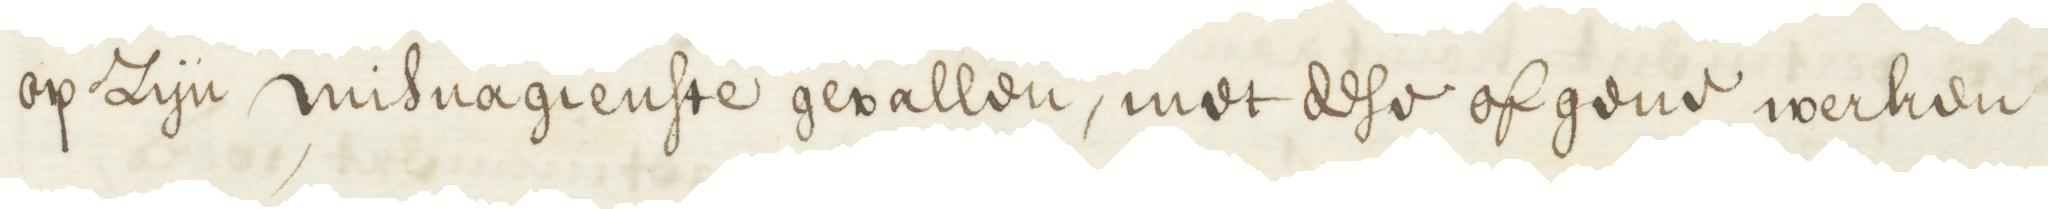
op zijn misnagieuste gevallen, met dese of gene werken
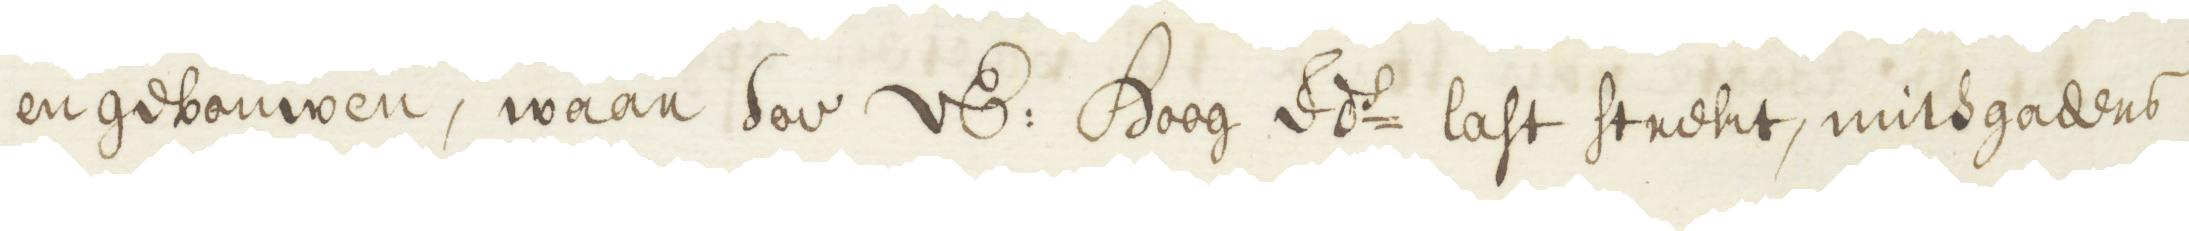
en gebouwen, waar toe vE: Hoog Ed=s last strekt, mitsgaders
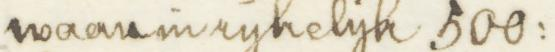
waar in rijkelijk 500:
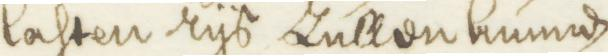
lasten rijs zullen kunnen
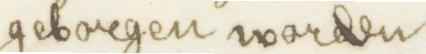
geborgen worden
